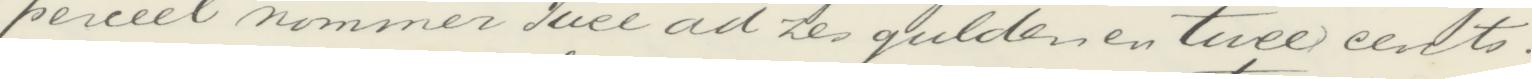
perceel nommer Twee ad zes gulden en twee cents.
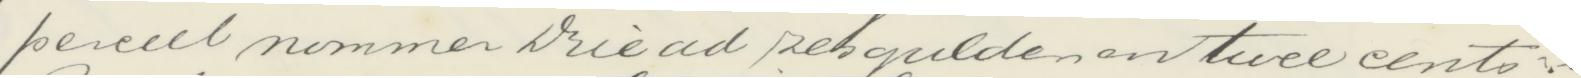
perceel nommer Drie ad zes gulden en twee cents:-
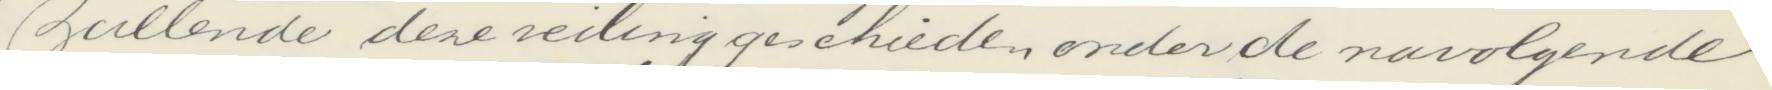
Zullende deze veiling geschieden onder de navolgende
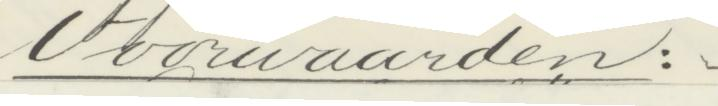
Voorwaarden:
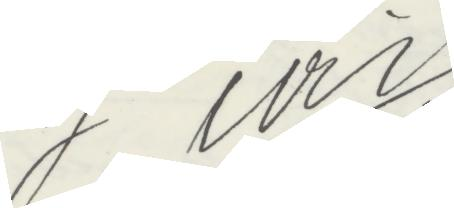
F
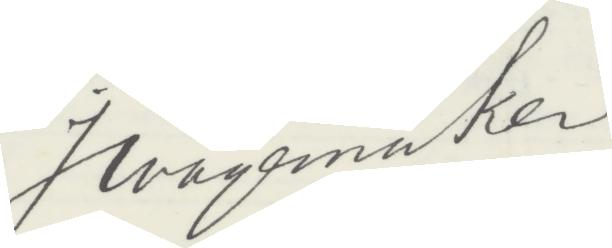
Jwagemaker
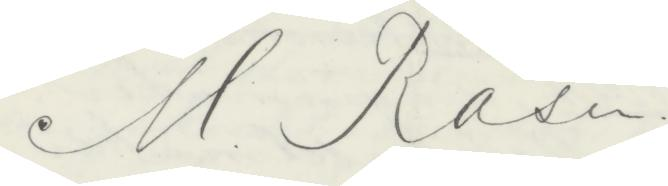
M. Rasen
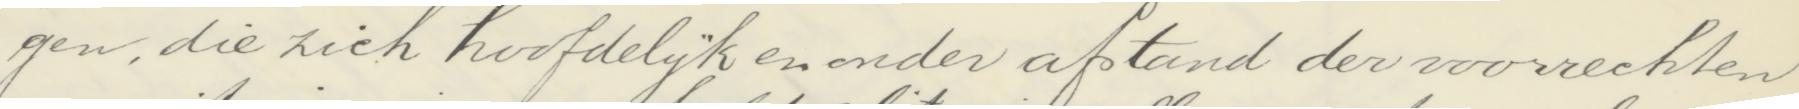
gen, die zich hoofdelijk en onder afstand der voorrechten
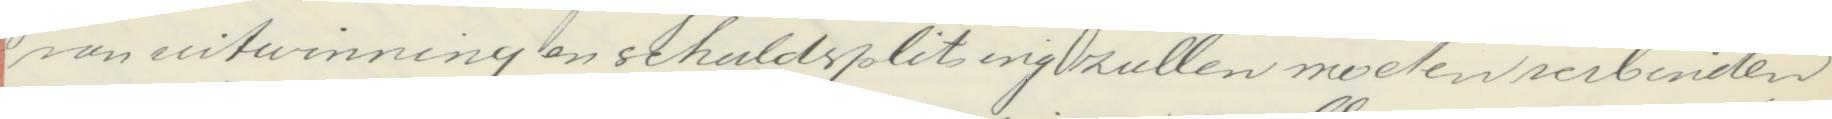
van uitwinning en schuldspliting zullen moeten verbinden
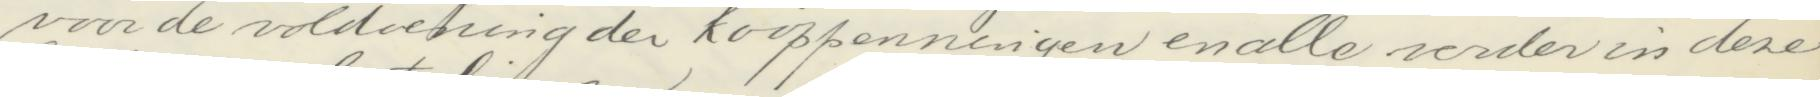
voor de voldoening der kooppenningen en alle verder in deze
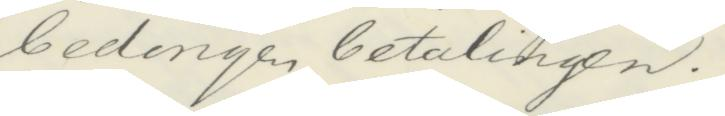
bedingen betalingen.
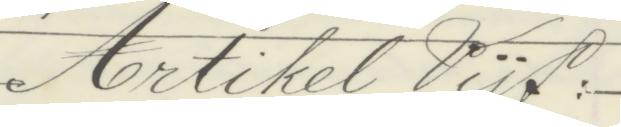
Artikel Vijf:
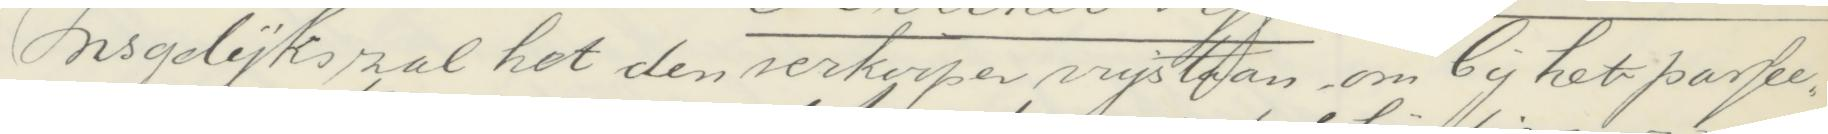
Insgelijks zal het den verkoper vrijstaan om bij het passee„
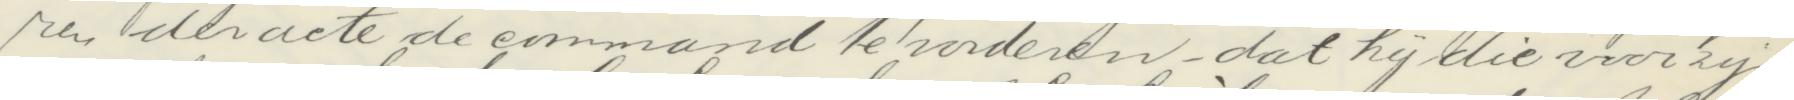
ren der acte de command te vorderen- dat hij die voor zijn
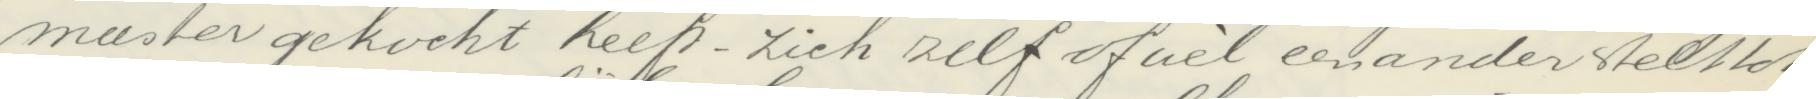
meester gekocht heeft- zich zelf of wel een ander stelt tot
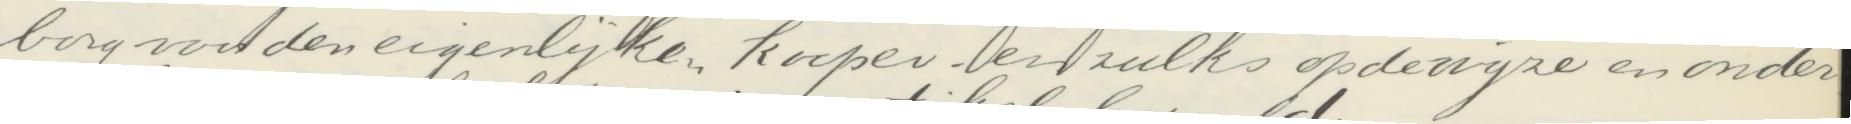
borg voor den eigenlijken kooper; en zulks op de wijze en onder
